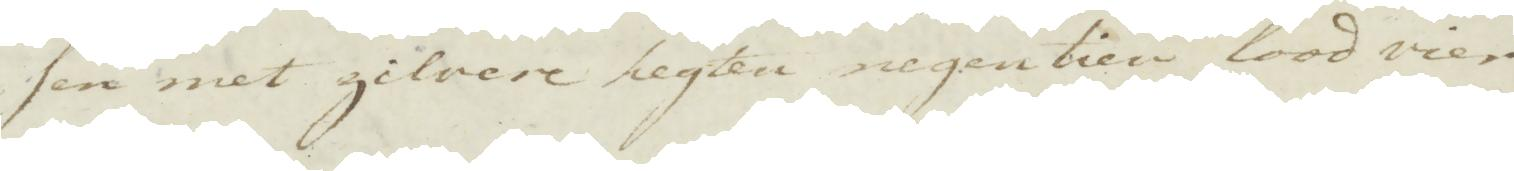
„sen met zilvere hegten negentien lood vier
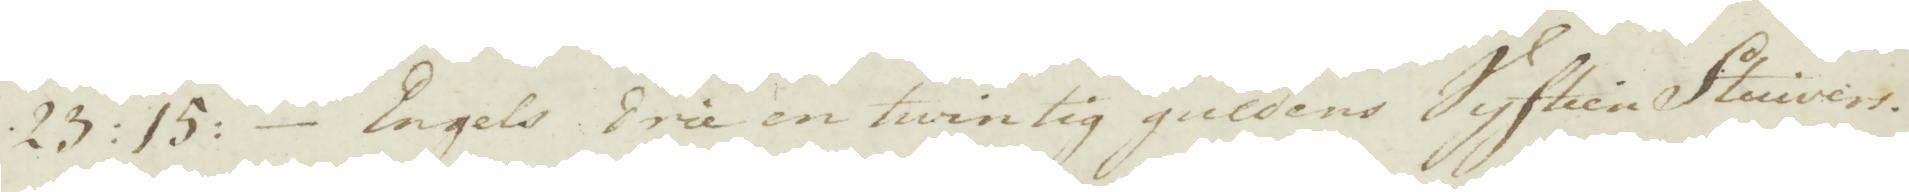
23:15:— Engels drie en twintig guldens Vyftien Stuivers.
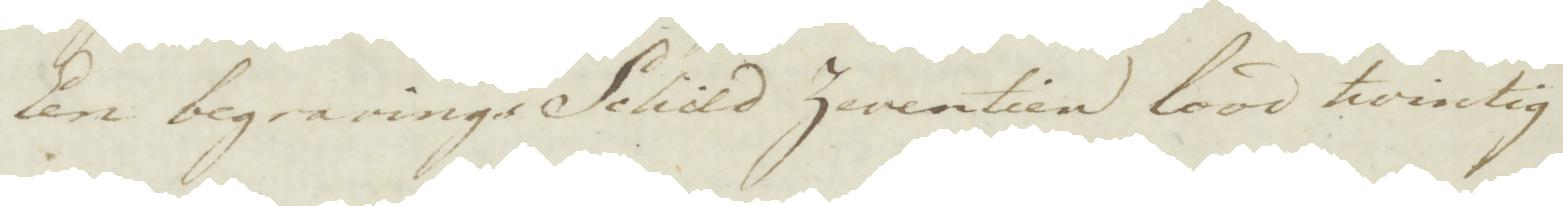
Een begravings Schild zeventien lood twintig
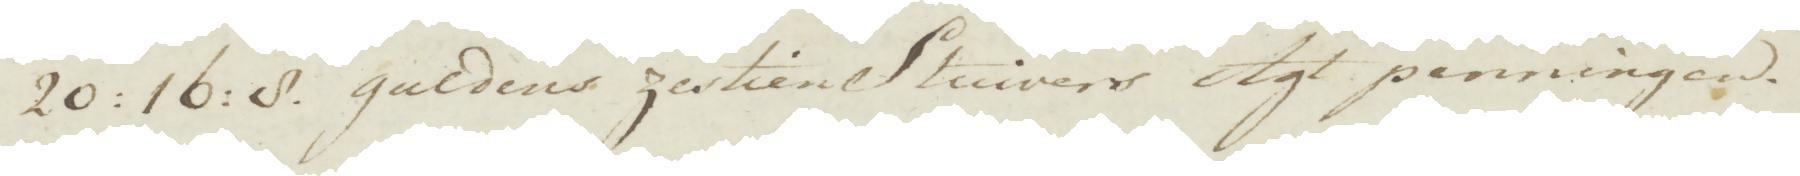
20:16:8: guldens zestien Stuivers Agt penningen.
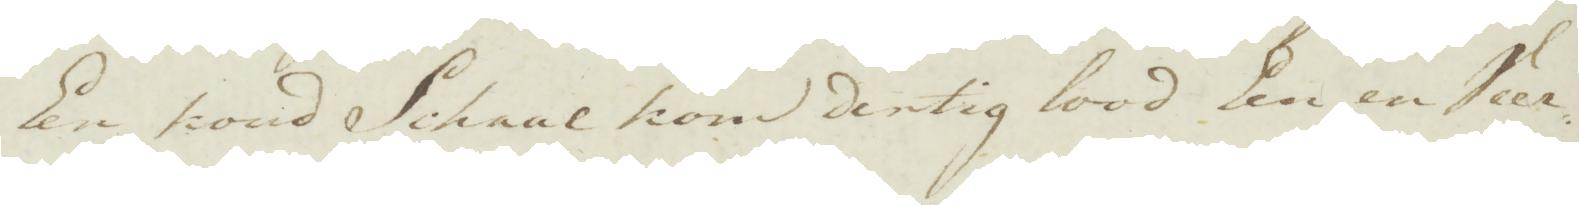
Een koud Schaal kom dertig lood Een en Veer„
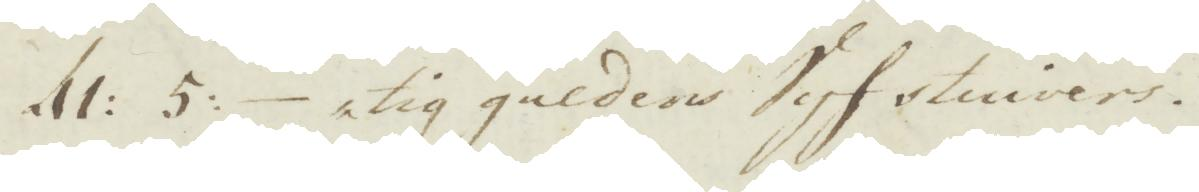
41:5:— „tig guldens vyf stuivers.
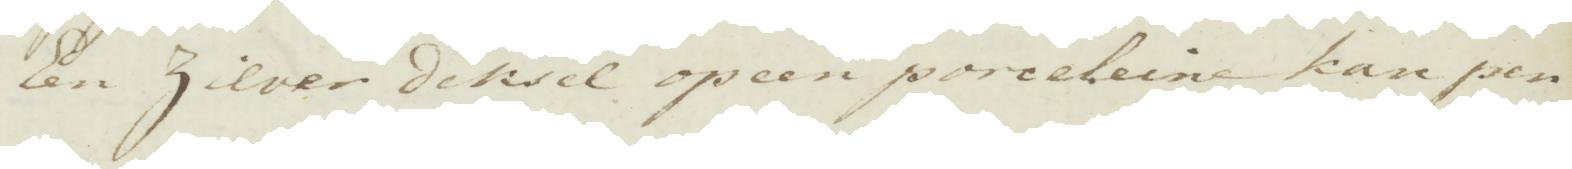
Een zilver deksel op een porceleine kan per
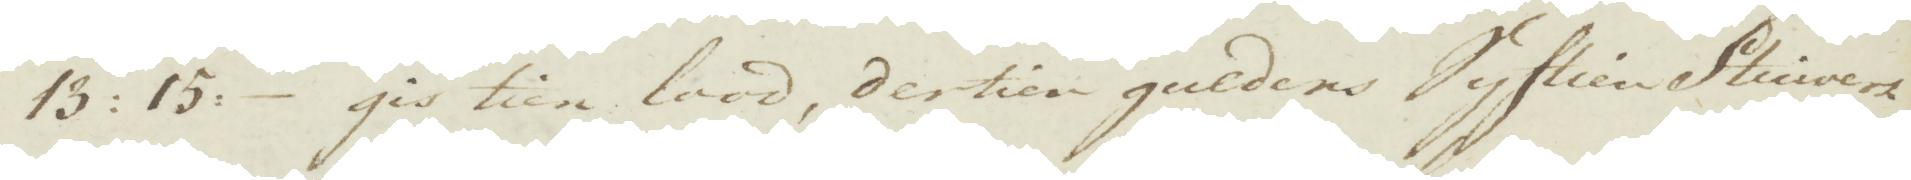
13:15:— gis tien lood, dertien guldens Vyftien Stuivers
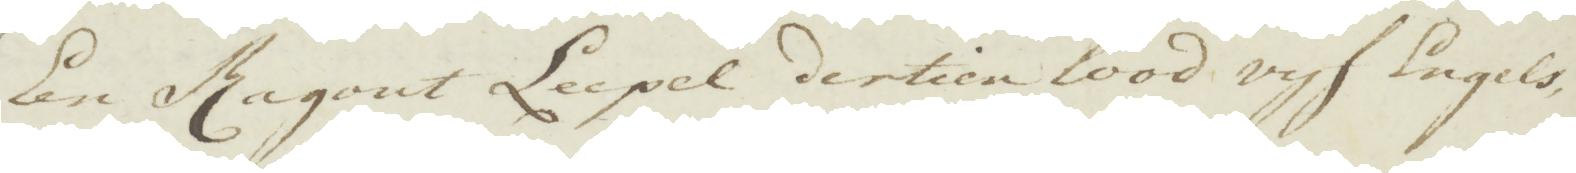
Een Ragout Leepel dertien lood vyf Engels,
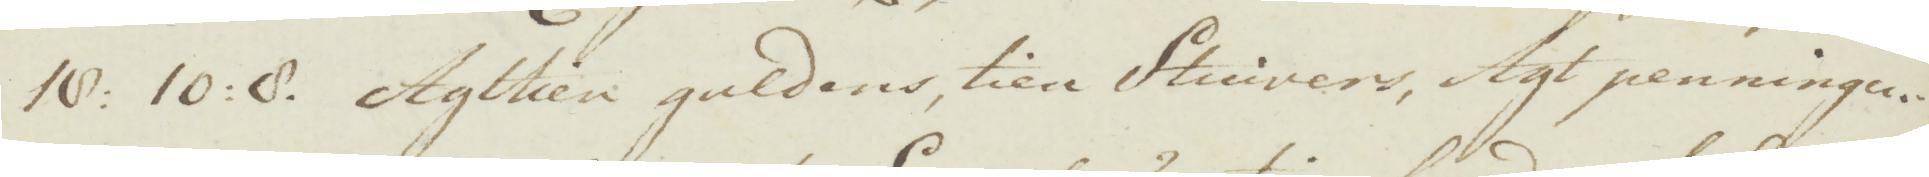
18:10:8. Agttien guldens, tien Stuivers, Agt penningen
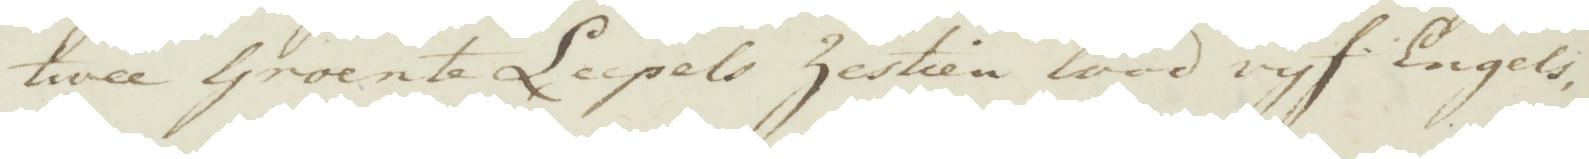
twee Groente Leepels zestien lood vyf Engels,
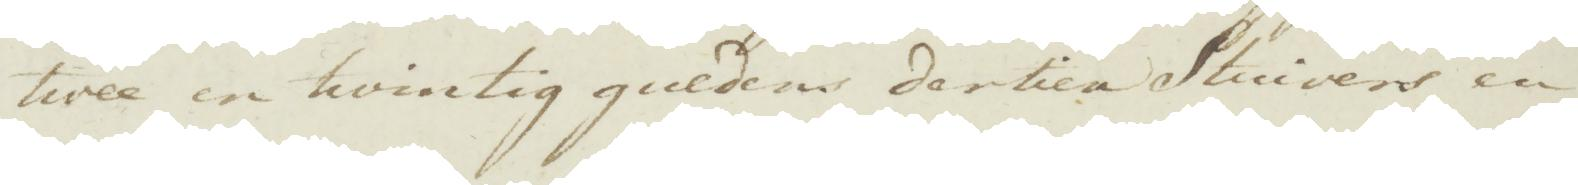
twee en twintig guldens dertien Stuivers en
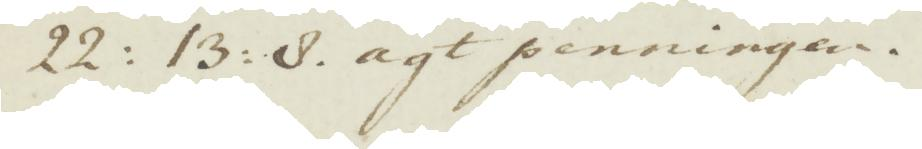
22:13:8. agt penningen.
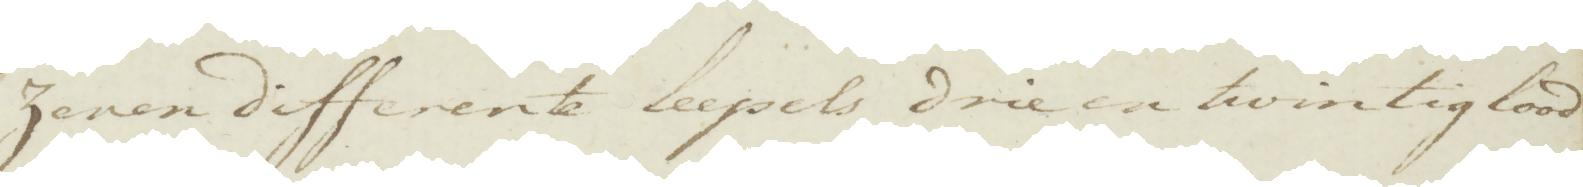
Zeven differente leepels drie en twintig lood
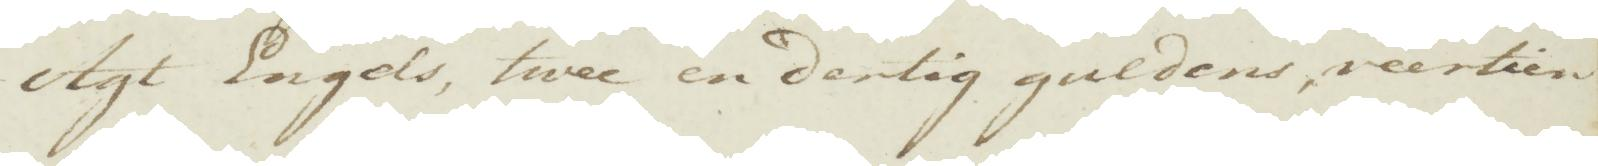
Agt Engels, twee en dertig guldens, veertien
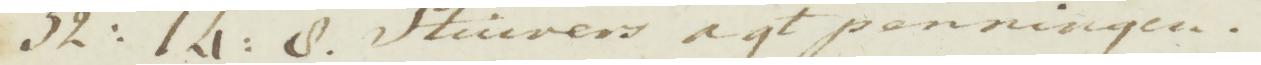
32:14:8. Stuivers agt penningen.
